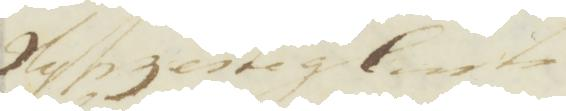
Vijf zestig Cents
